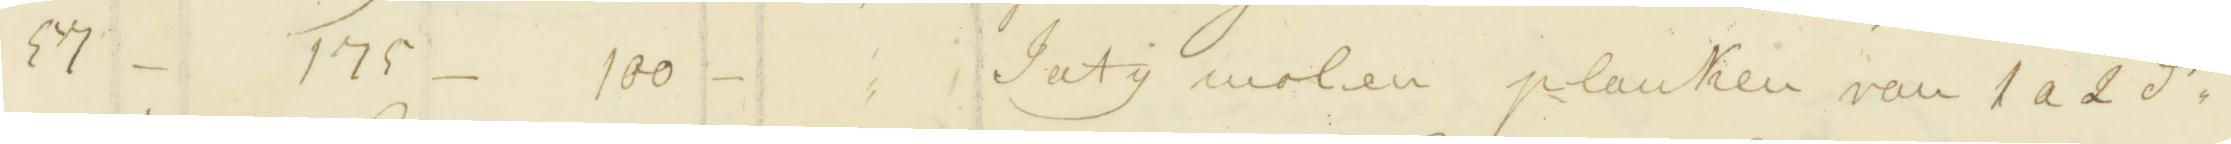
57 — 175 — 100 — „ Iatij molen planken van 1 a 2 d„m
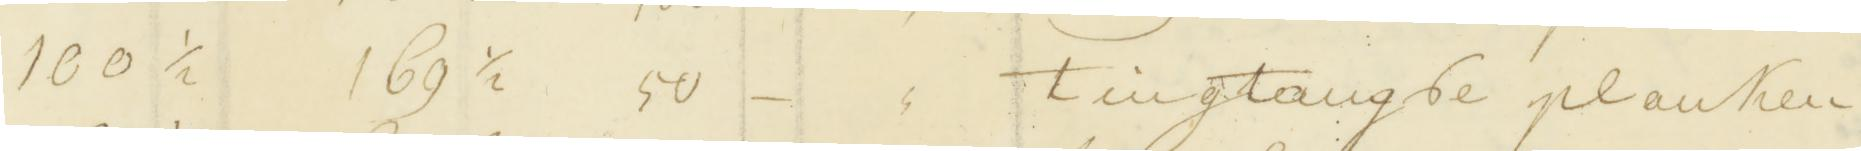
100½ 169½ 50 — „ tingtangse planken
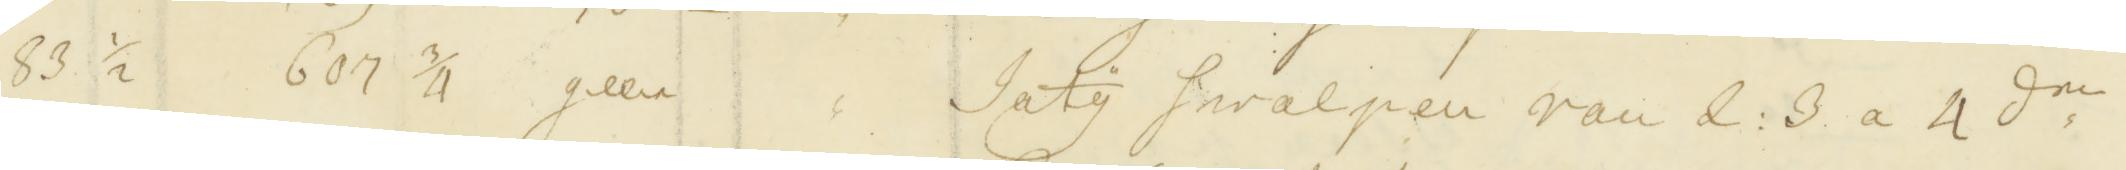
83½ 607¾ geen „ Iatij swalpen van 2: 3 a 4 d„m
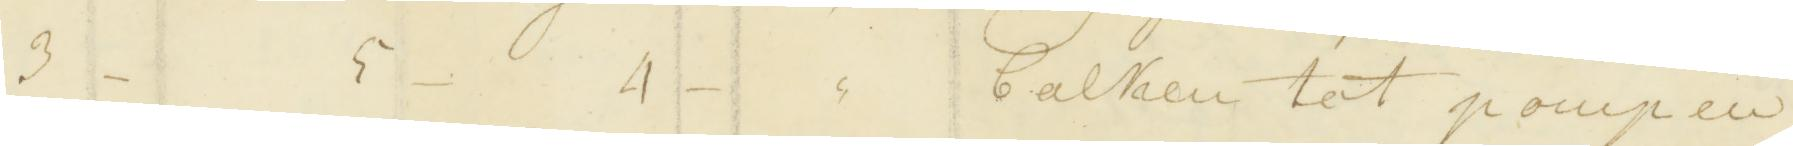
3 — 5 — 4 — „ balken tot pompen
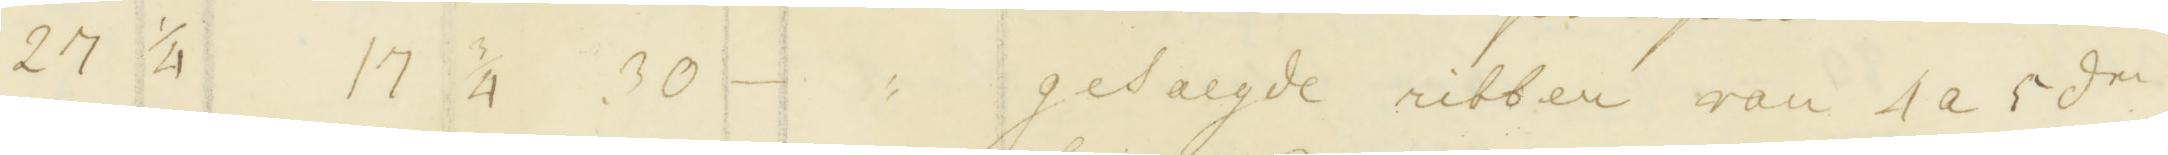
27 ¼ 17 ¾ 30 — „ gesaegde ribben van 4 a 5 d.m
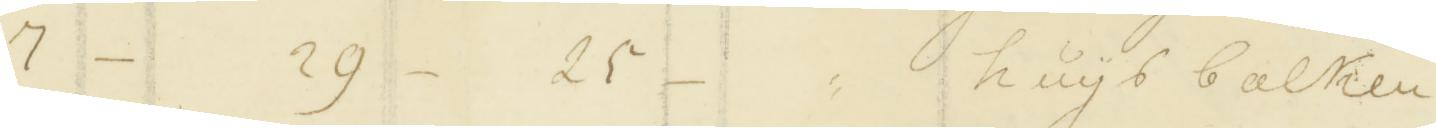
7 — 29 — 25 — „ huijs balken
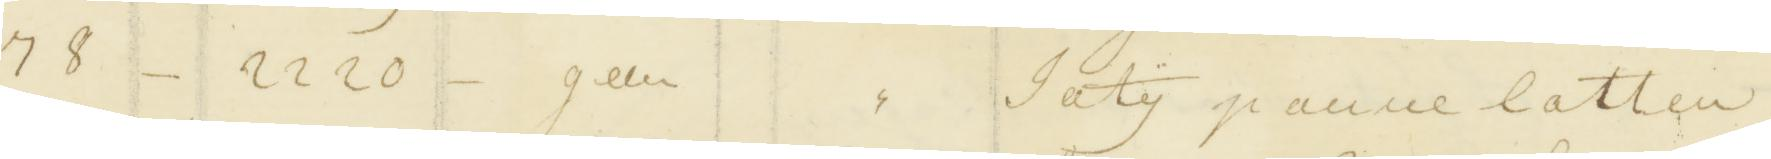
78 — 2220 — geen „ Iatij panne latten
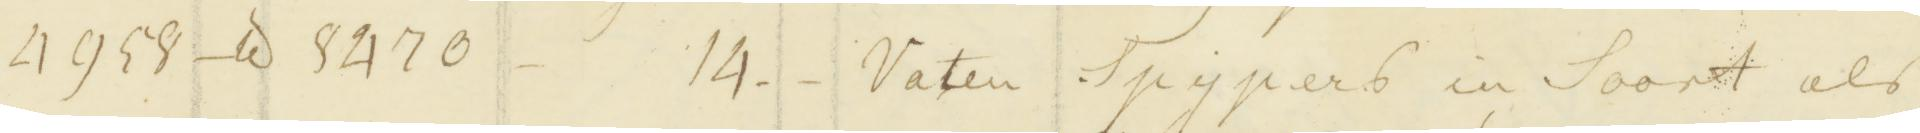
4958—lb 8470 — 14 - Vaten spijpers in soort als
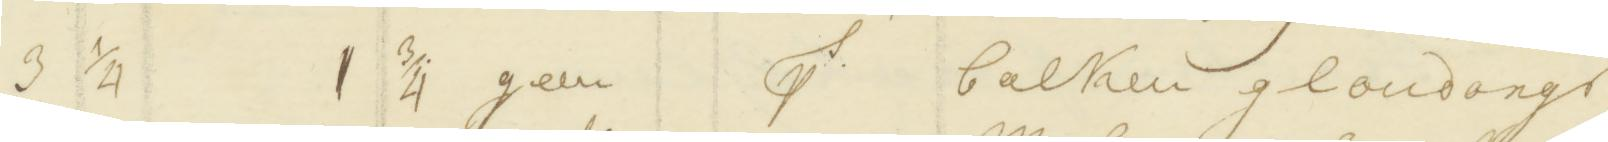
3¼ 1¾ geen p.s balken glondongs
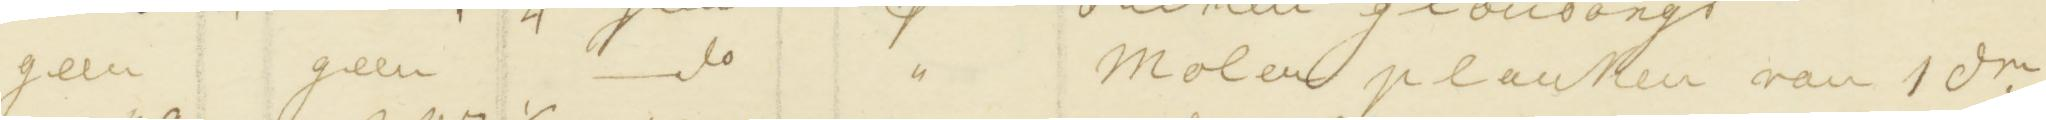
geen geen do „ Molen planken van 1 d„m
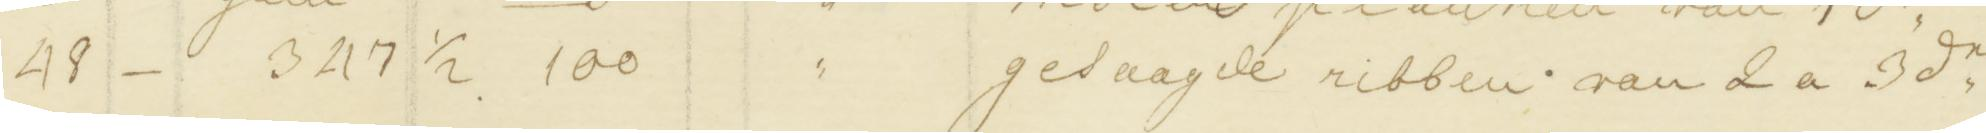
48 — 347½ 100 „ gesaagde ribben van 2 a 3 d„m
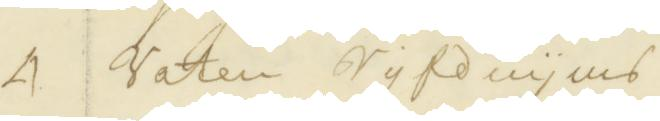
4 vaten vijfduijms
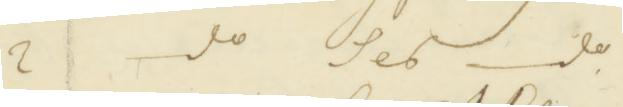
2 do ses d.o
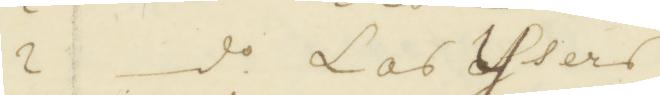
2 d.o Las Ysers
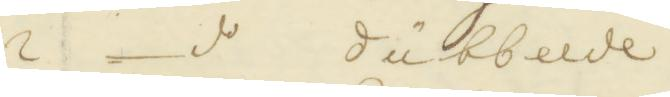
2 do dubbelde
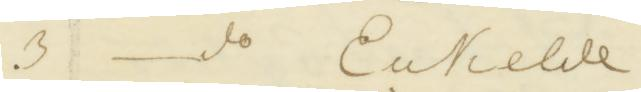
3 do Enkelde
